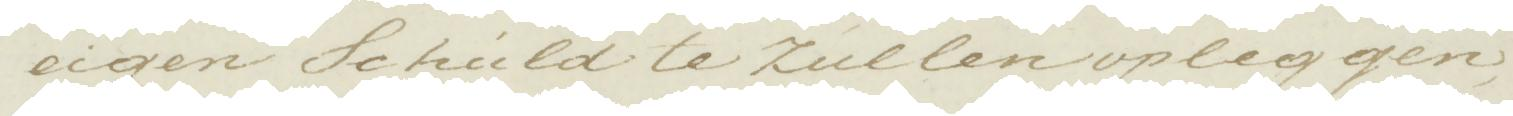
eigen schuld te zullen opleggen,
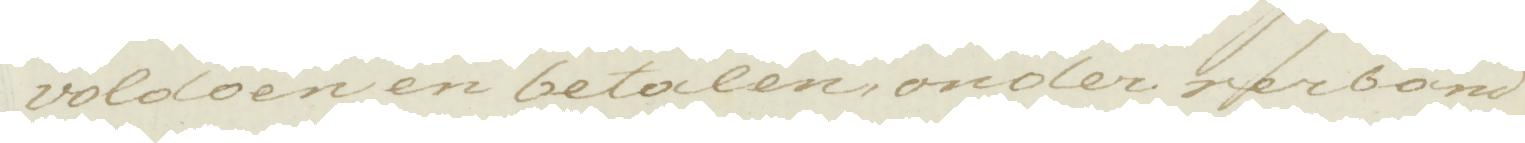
voldoen en betalen, onder verband
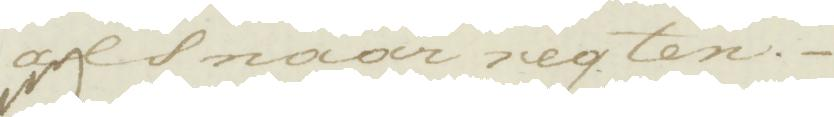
als naar regten.-
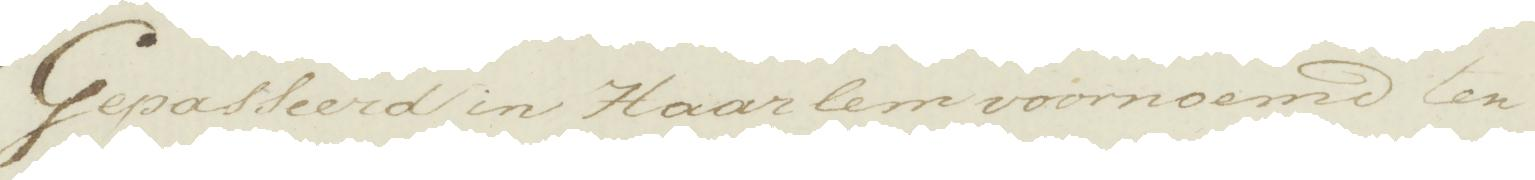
Gepasseerd in Haarlem voornoemd ten
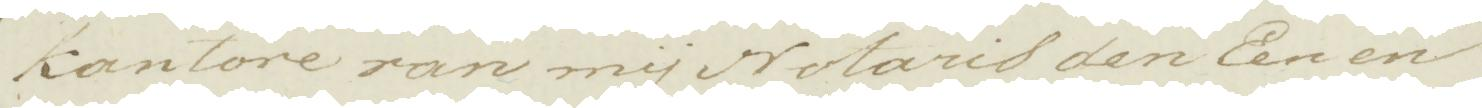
kantore van mij Notaris den Een en
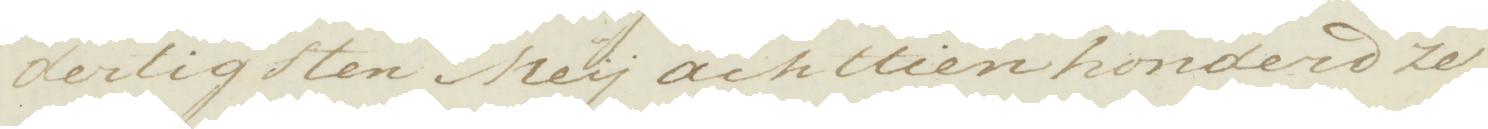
dertigsten Meij achttien honderd ze
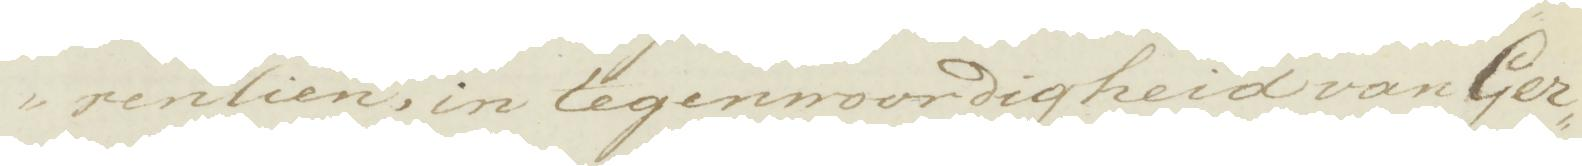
„ventien, in tegenwoordigheid van Ger„
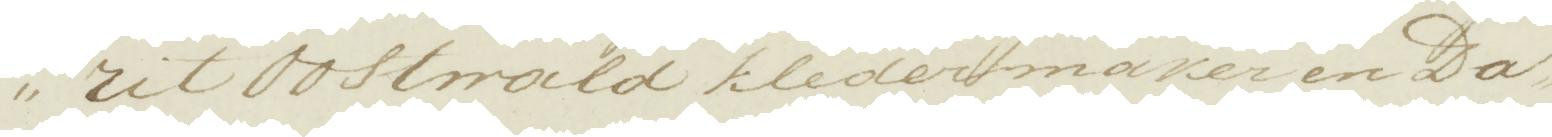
rit Oostwald kledermaker en Da„
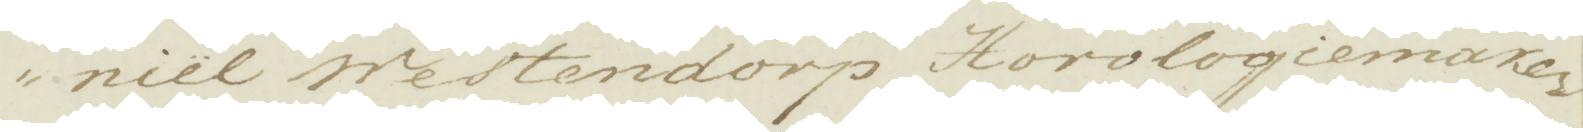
„niel Westendorp Horologiemaker
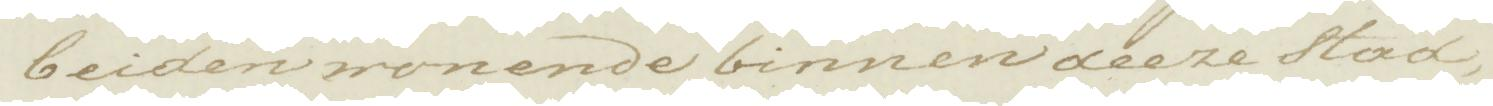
beiden wonende binnen deeze stad,
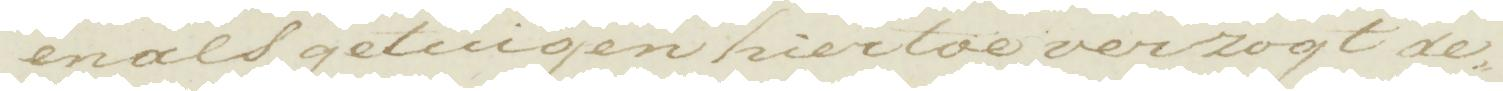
en als getuigen hier toe verzogt de„
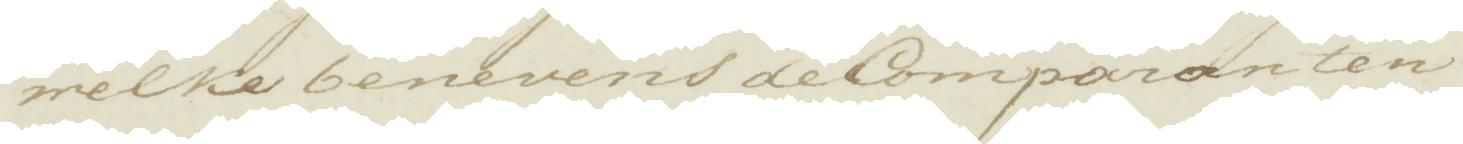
welke benevens de Comparanten
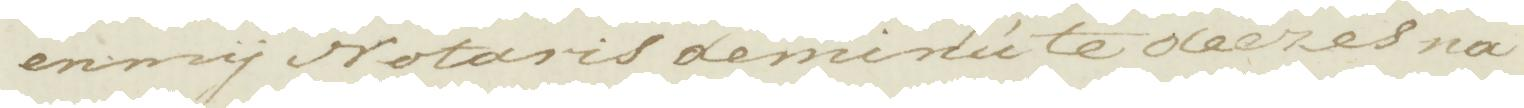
en mij Notaris de minute deezes na
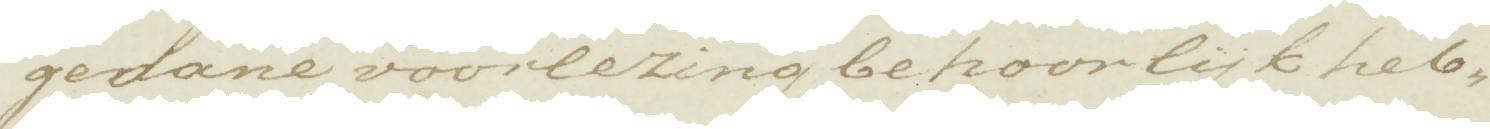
gedane voorlezing behoorlijk heb„
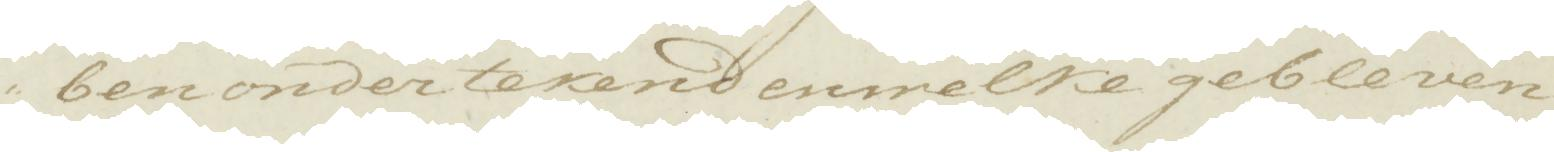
„ ben onder tekend enwelke gebleven
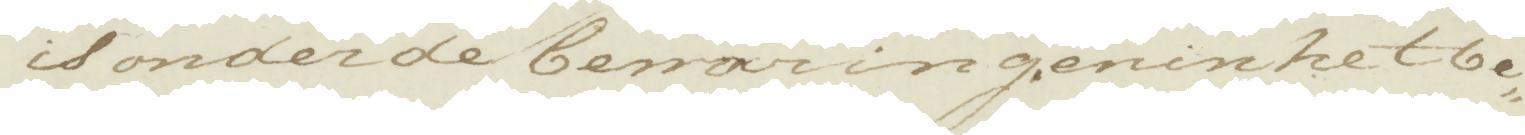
is onder de bewaring en in het be„
